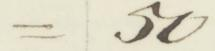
= 50
